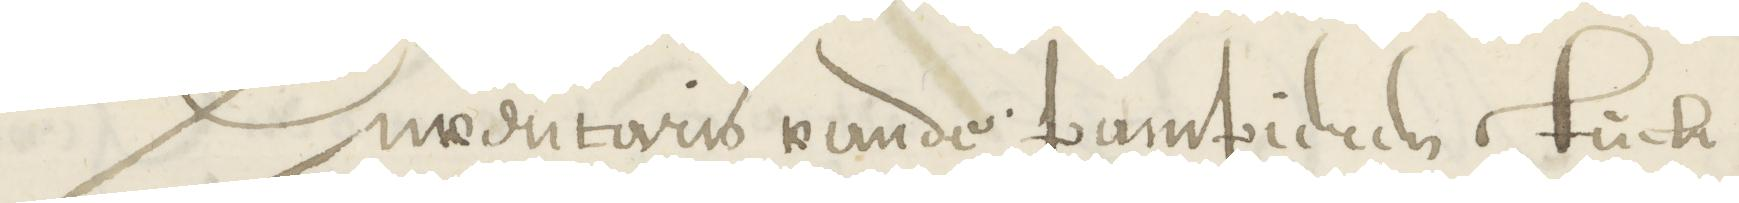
Jnventaris vande pampieren stuck
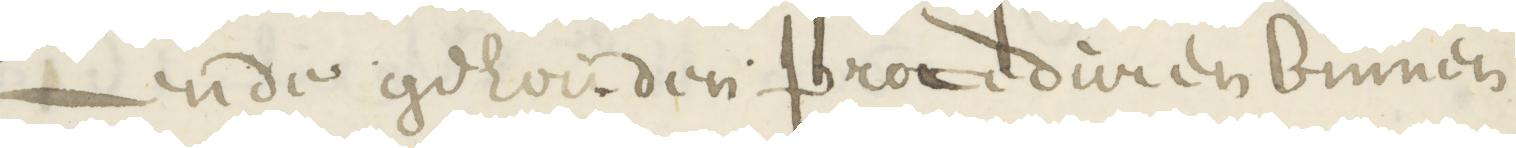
ende gehouden proceduren binnen
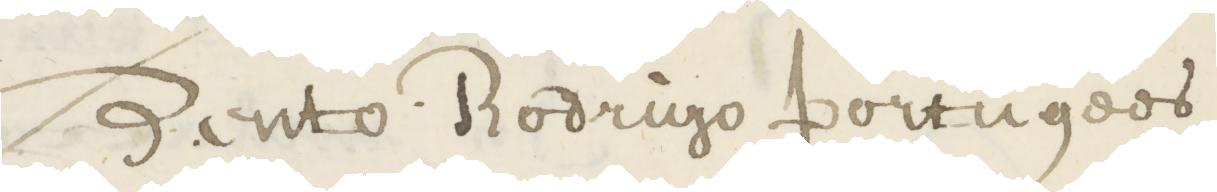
Bento Rodrigo portugees
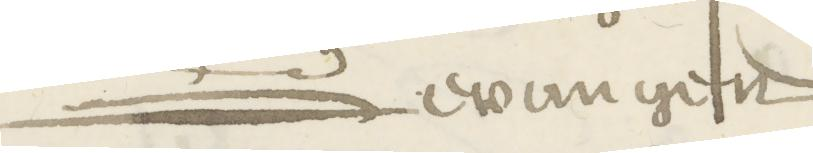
Gevangen
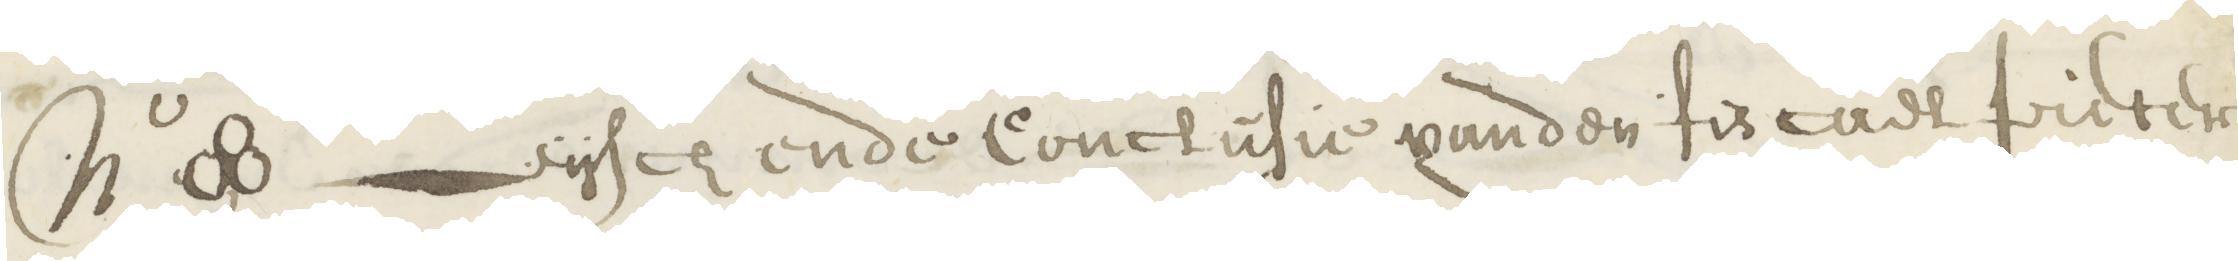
No ¶ eijsch ende Conclusie vanden fiscael pieter
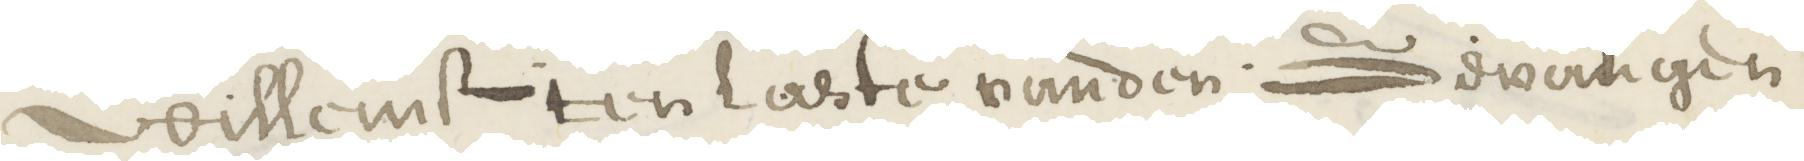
willems ten laste van den Gevangen
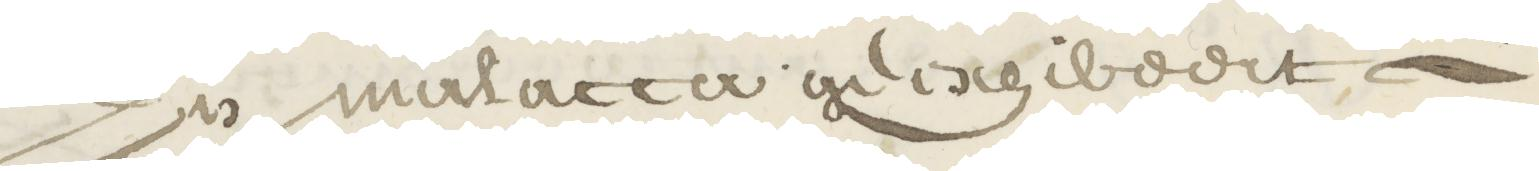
Jn malacca geexhibeert —
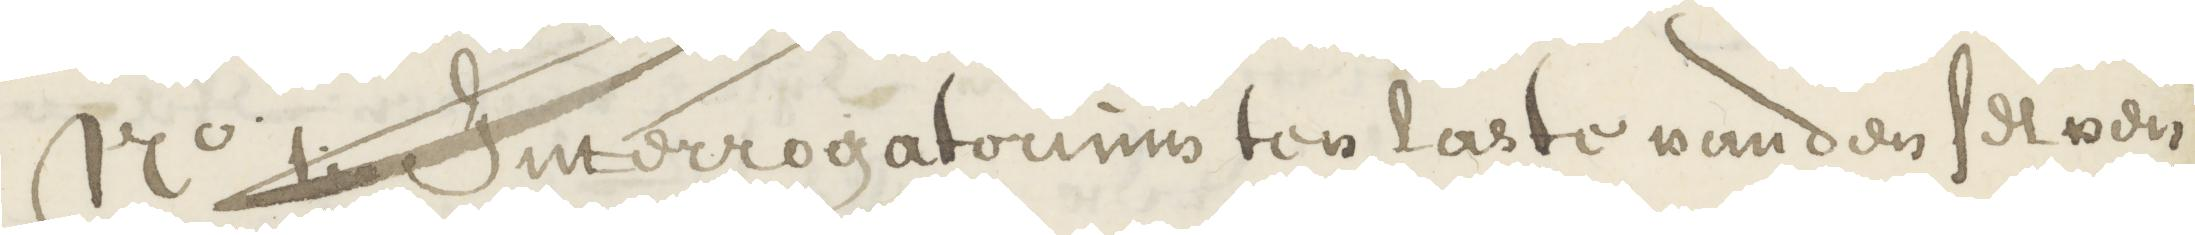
No 1: Interrogatorium ten laste van den selven
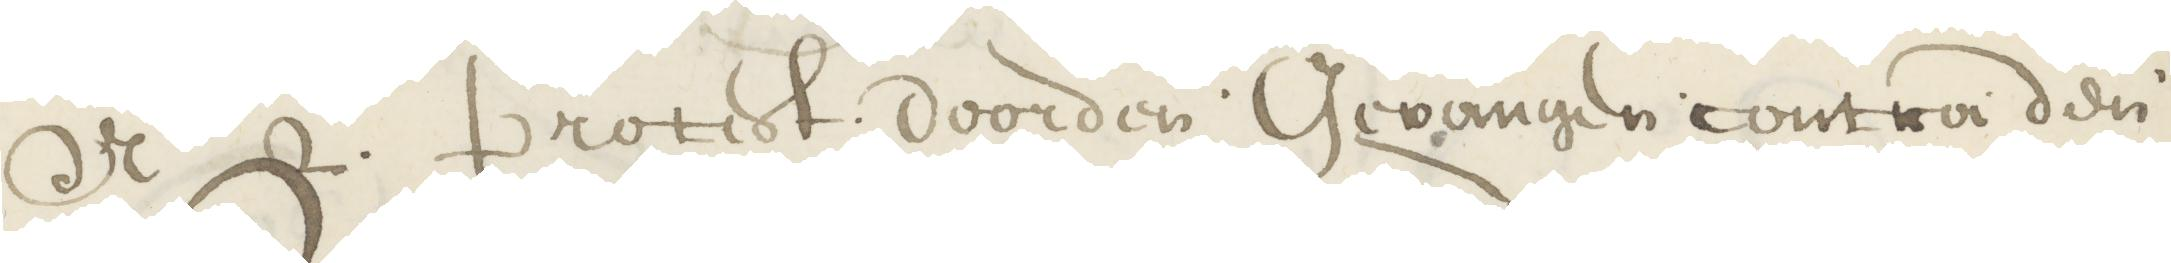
No 2. protest. door den Gevangen contra den
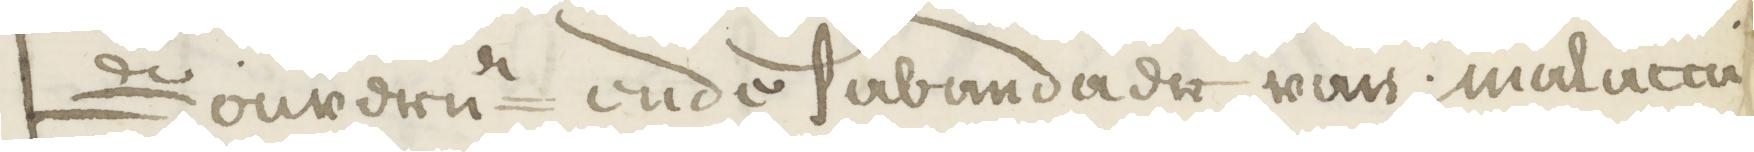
Gouvern=r ende sabandaer van malacca
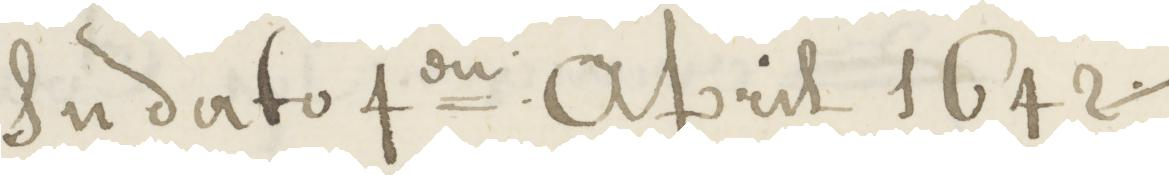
In dato 4=en April 1642.
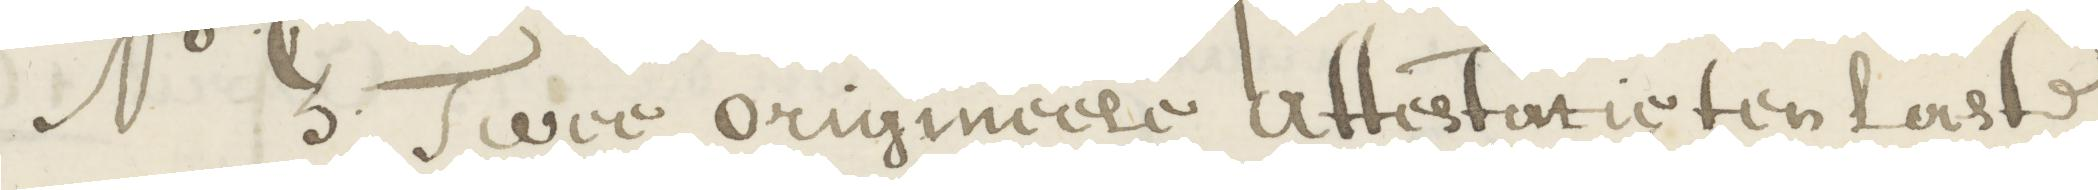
No 3. Twee origineele attestatie ten laste
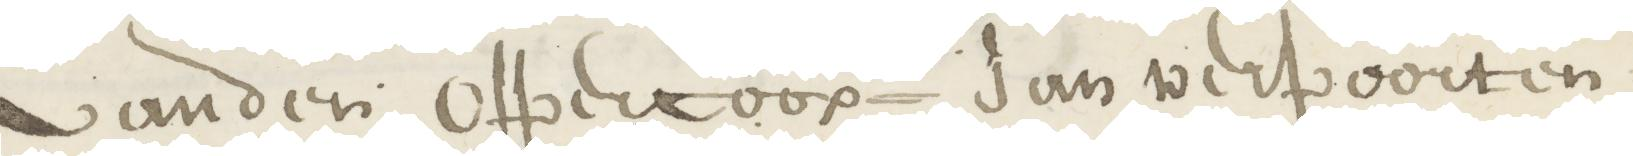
vanden oppercoop=m Ian verpoorten
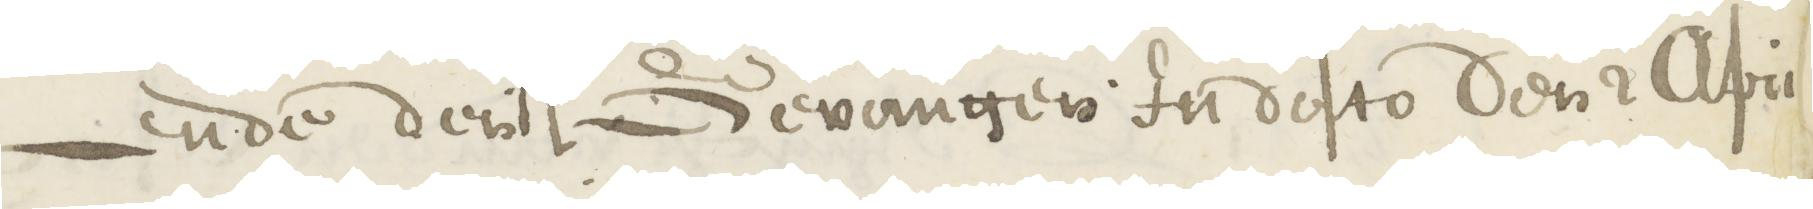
ende den Gevangen In dato den 2 April
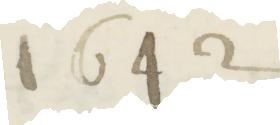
1642
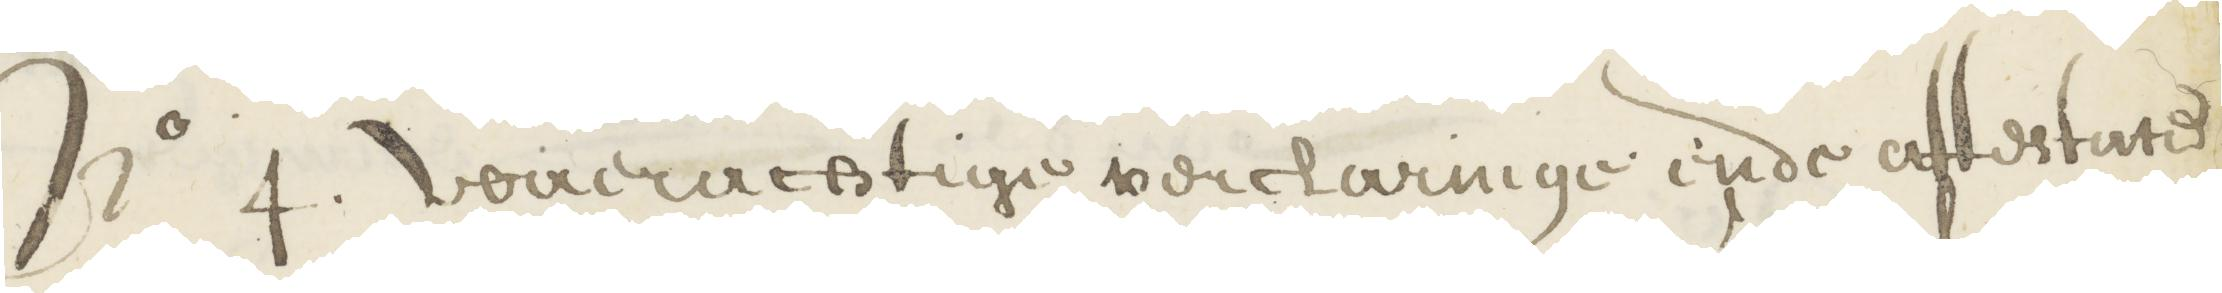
No 4. waerachtige verclaringe inde attestatie
